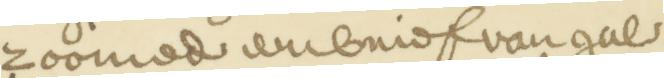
zoomede eenbrief van gale
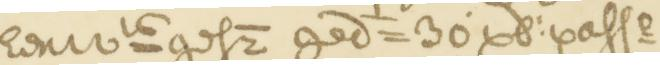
herw=ts gesz ged=t 30 xb: pass=o
